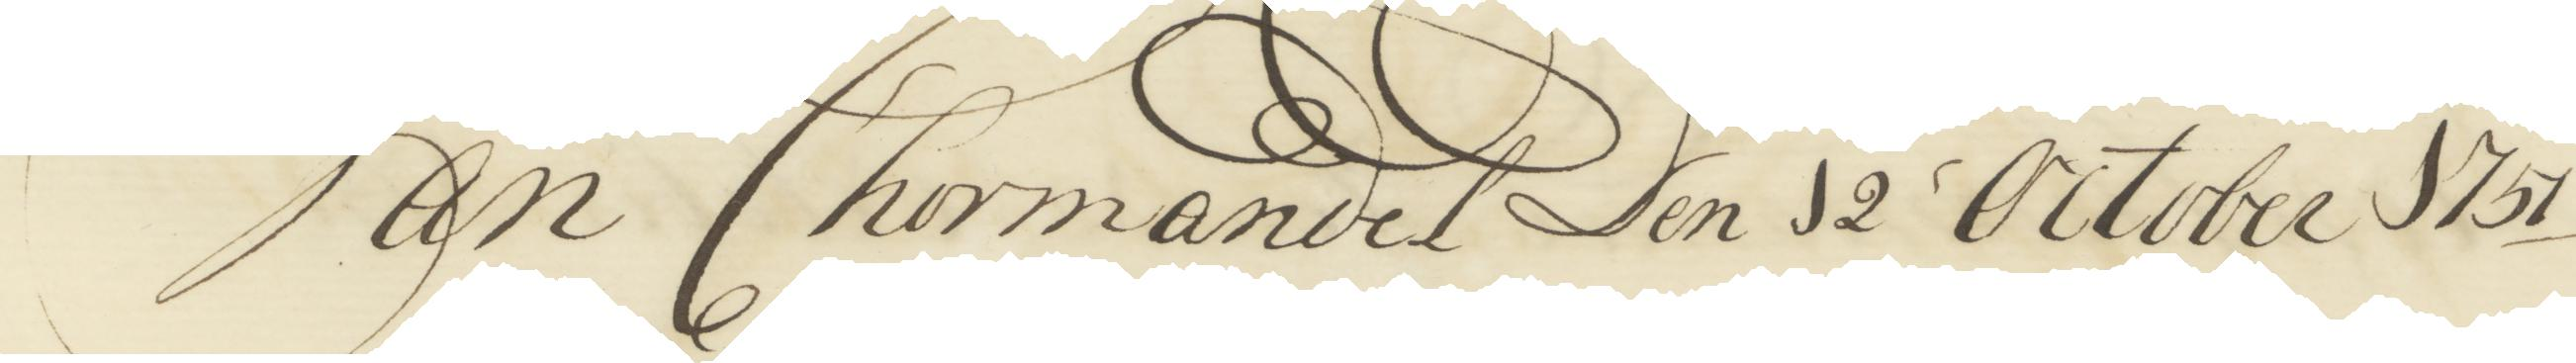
Van Chormandel Den 12' October 1751
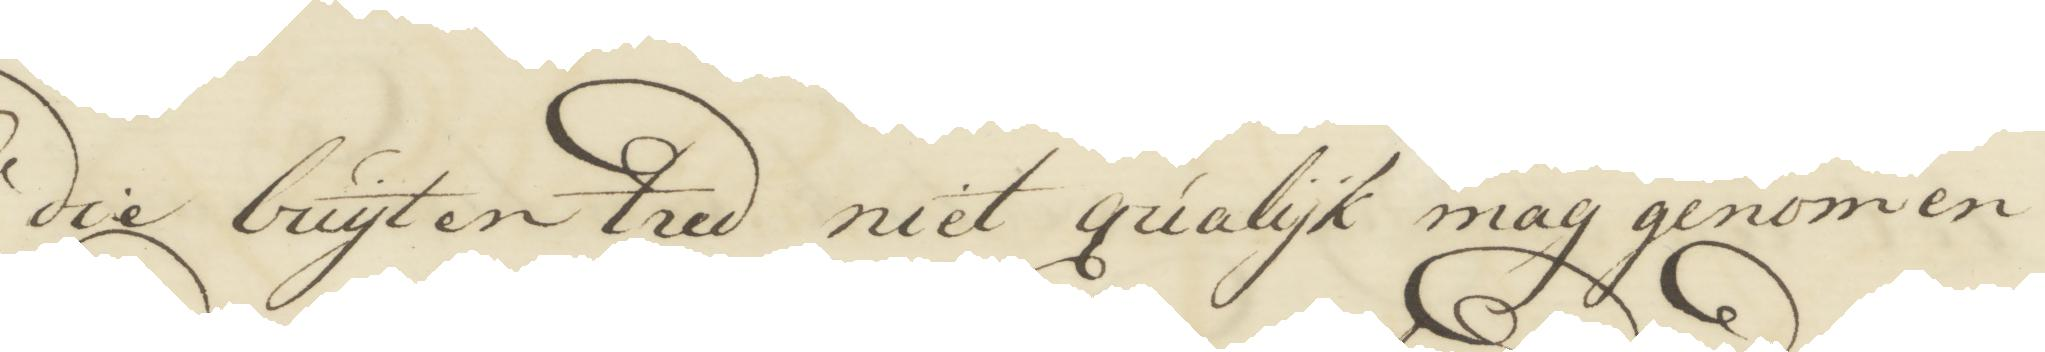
die buijten tred niet qualijk mag genomen
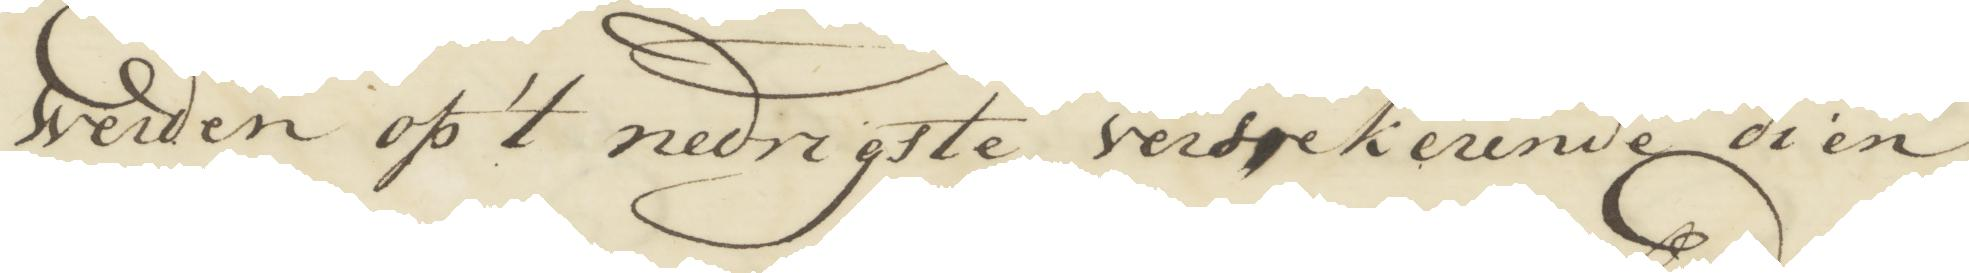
werden op ’t nedrigste versoekerende dien
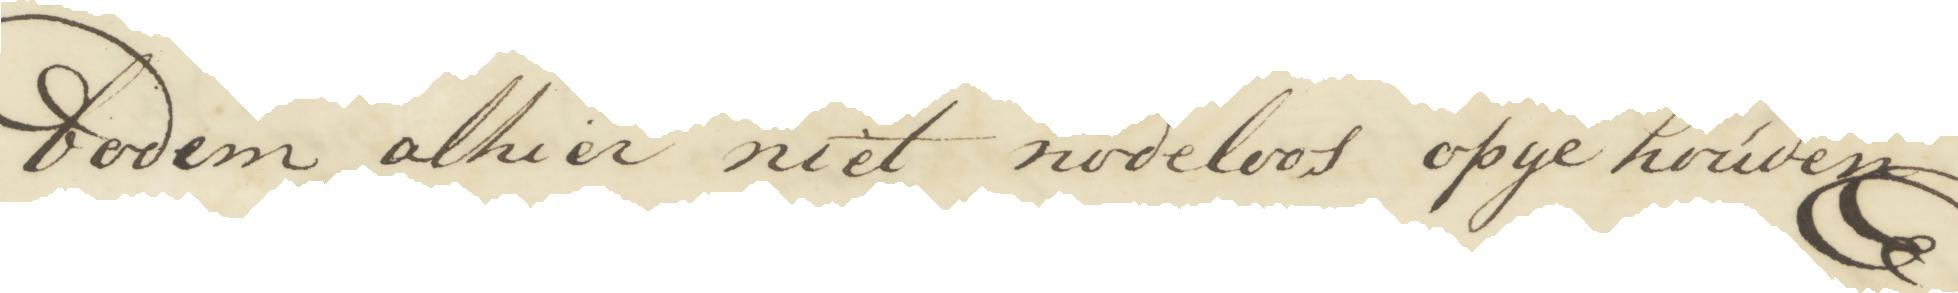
bodem alhier niet nodeloos opgehouden
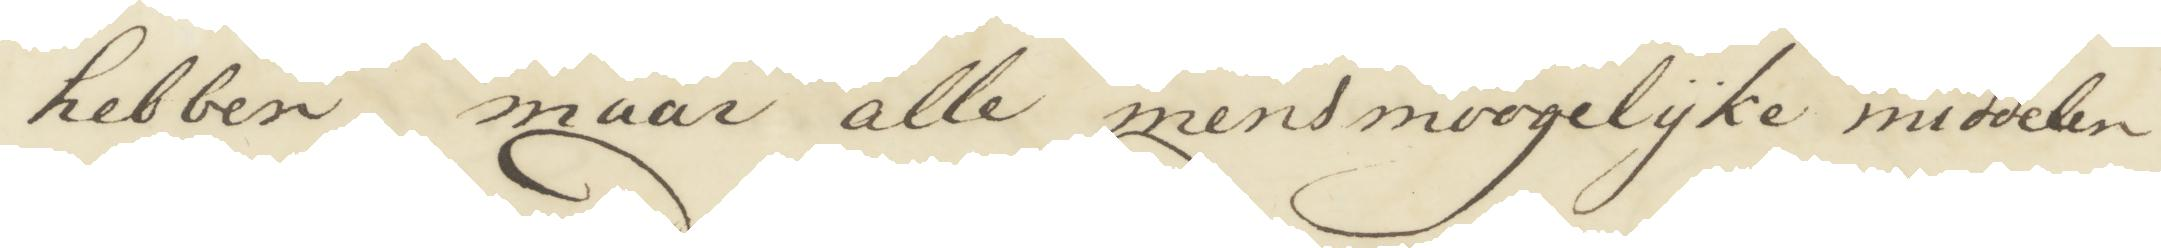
hebben, maar alle mensmoogelijke middelen
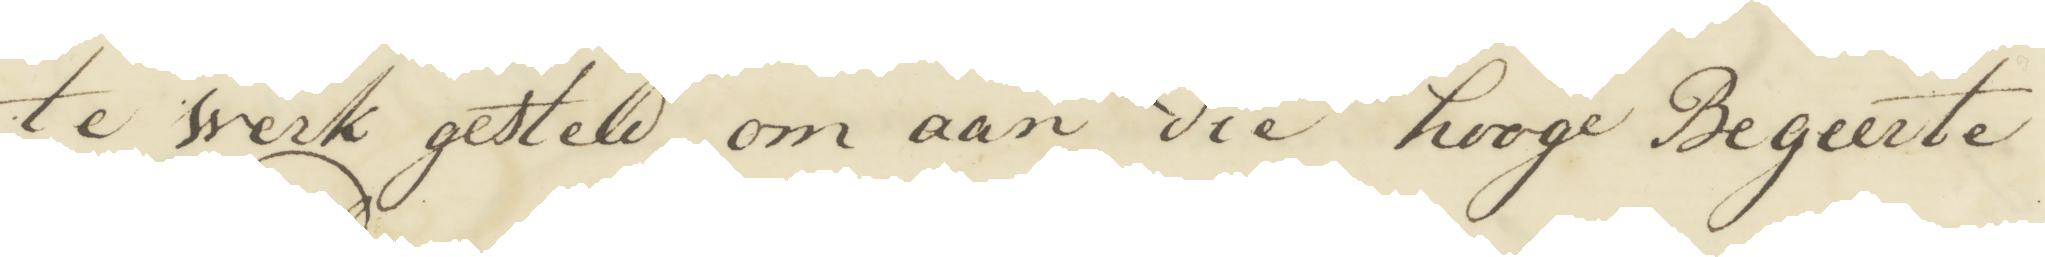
te werk gesteld om aan die hooge Begeerte
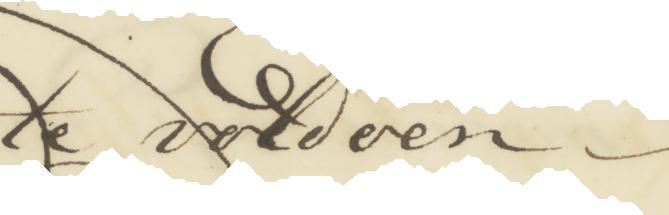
te voldoen—
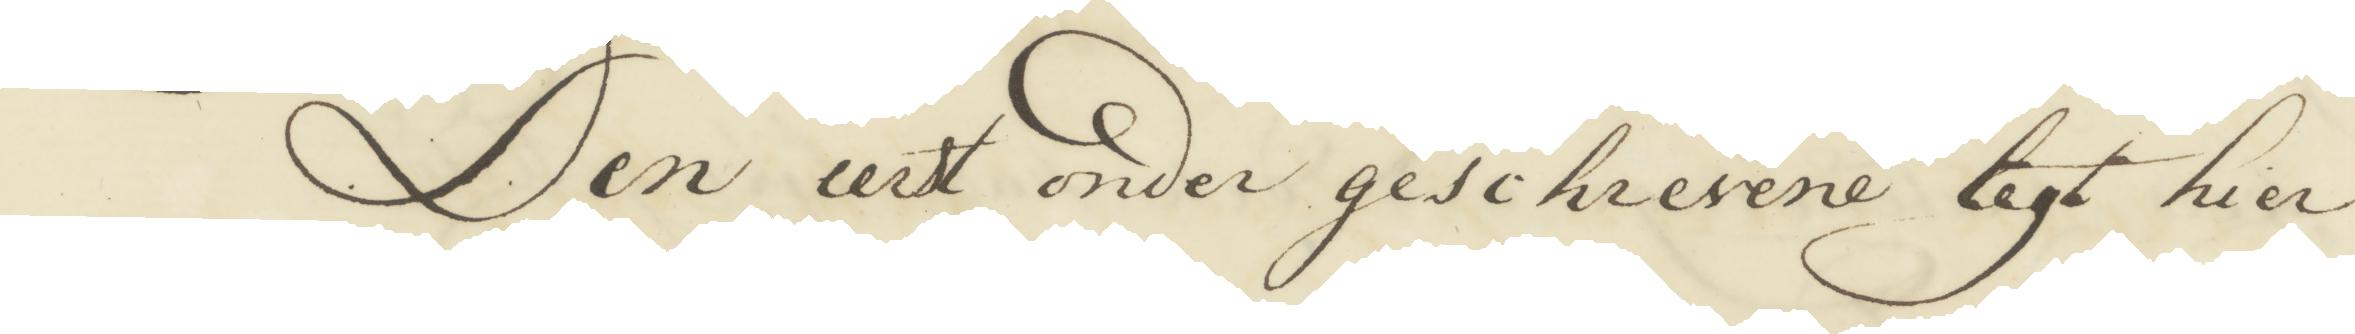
Den eerst onder geschrevene legt hier
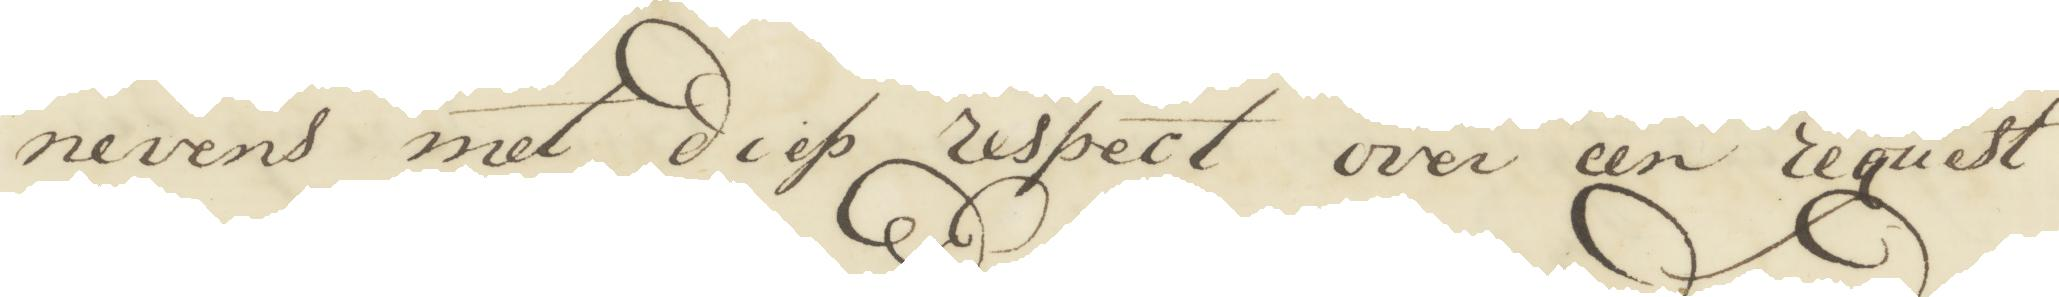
nevens met diep respect over een request
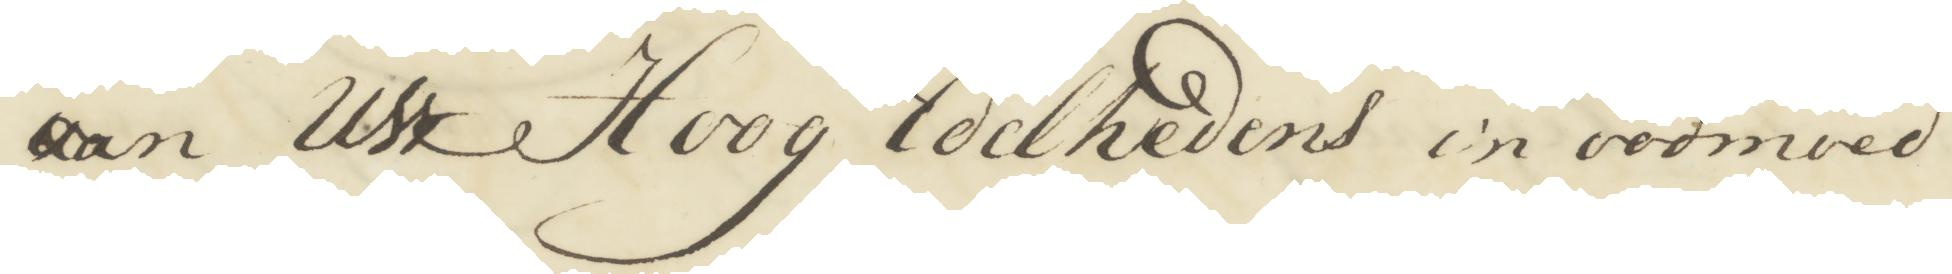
aan UW Hoog Edelhedens in oodmoed
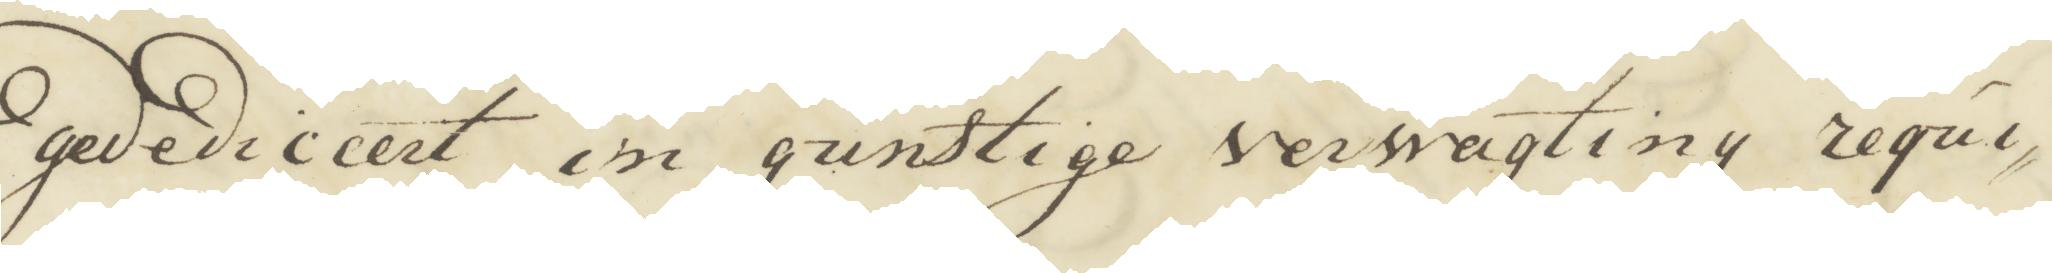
gedediceert in gunstige verwagting requi„
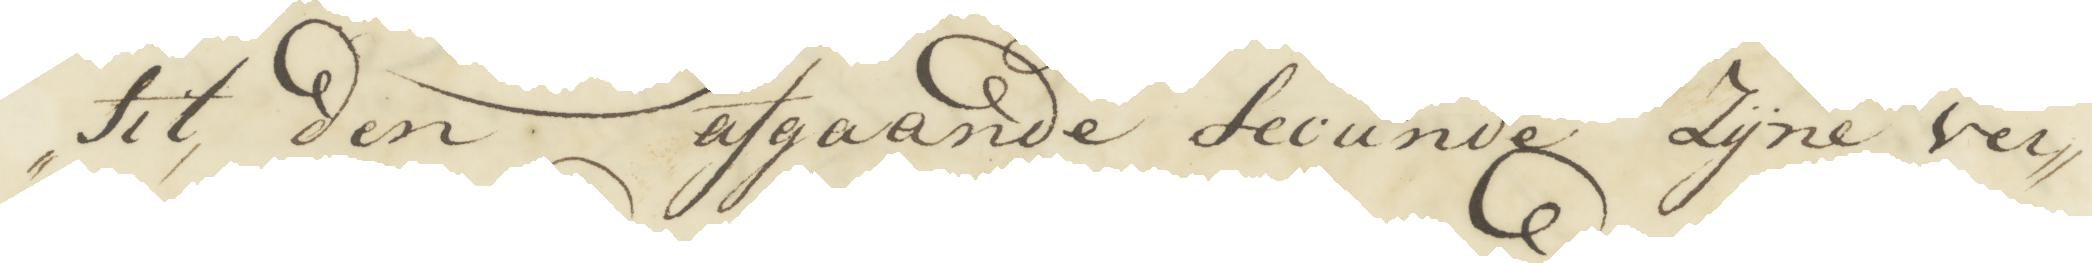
„sit, den afgaande secunde zijne ver„
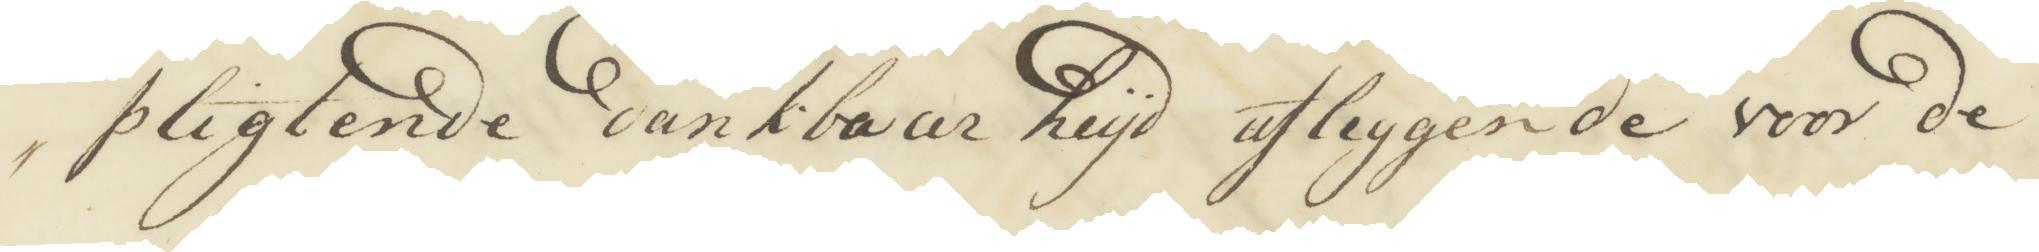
„pligtende dankbaar heijd afleggende voor de
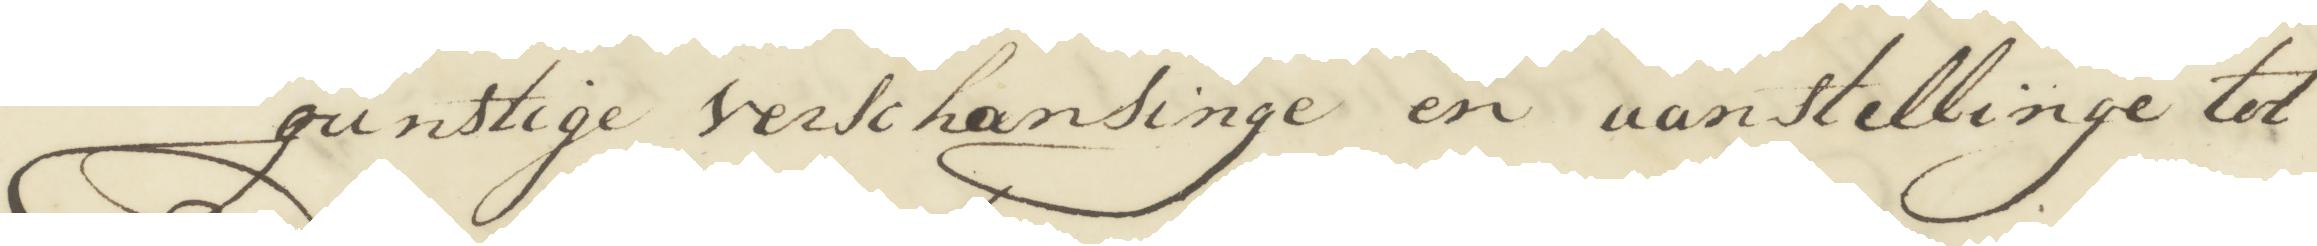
gunstige verschansinge en aanstellinge tot
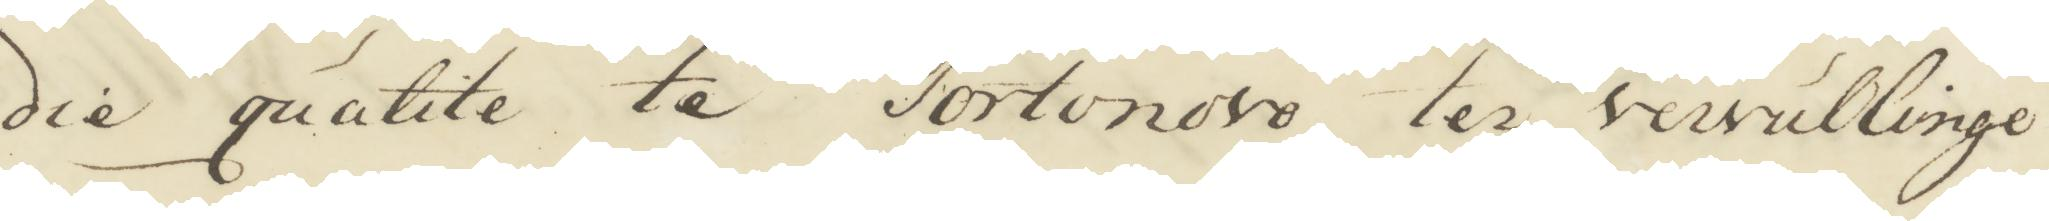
die qualite te Portonovo ter vervullinge
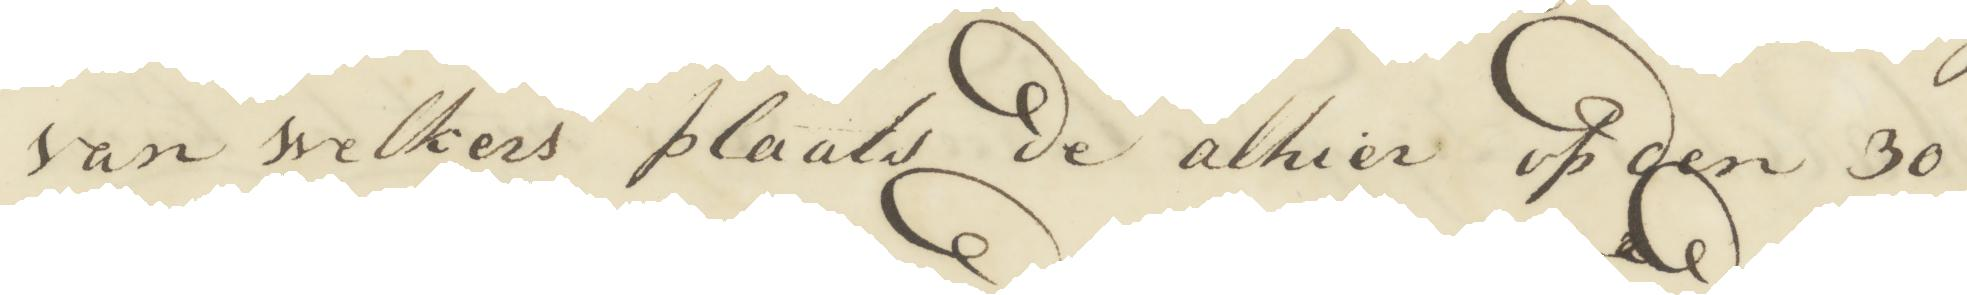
van welkers plaats de alhier op den 30
